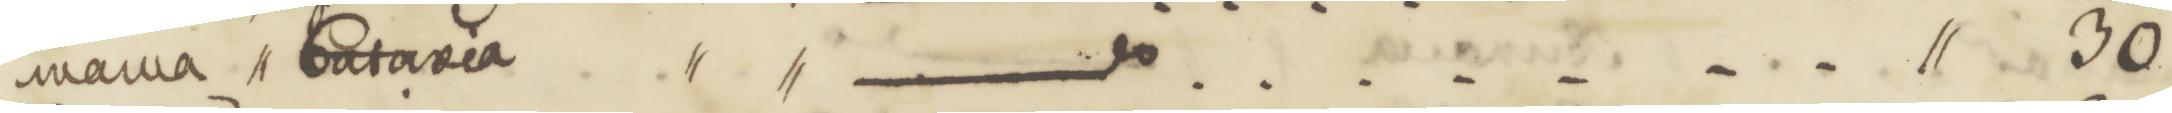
mama „ batavia „ „ do - - - - - - - „ 30
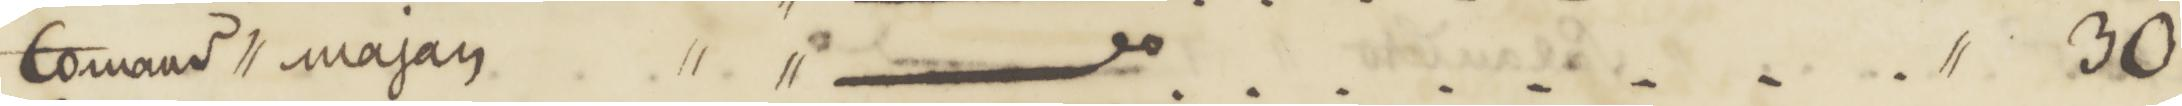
tomare „ majan „ „ do - - - - - - - - „ 30
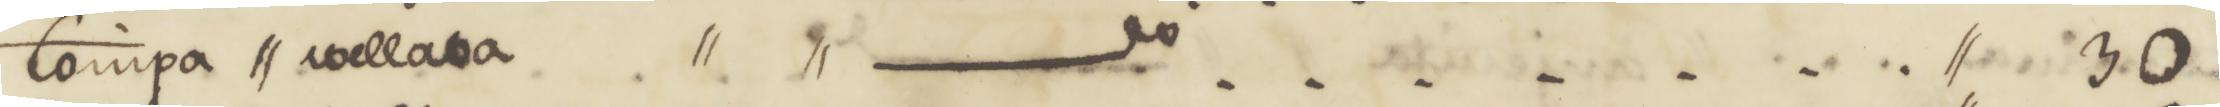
tompa „ wellava „ „ do - - - - - - - „ 30
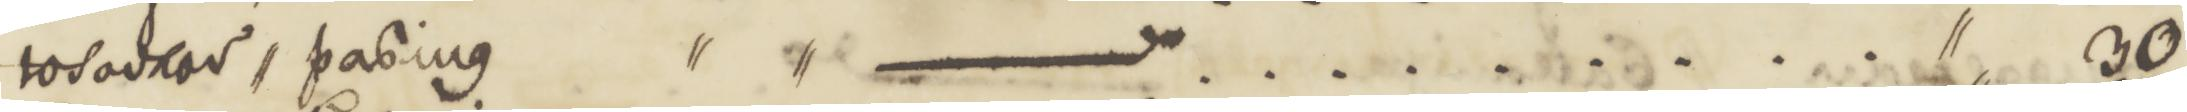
tosoekoe „ pasing „ „ do - - - - - - - - - „ 30
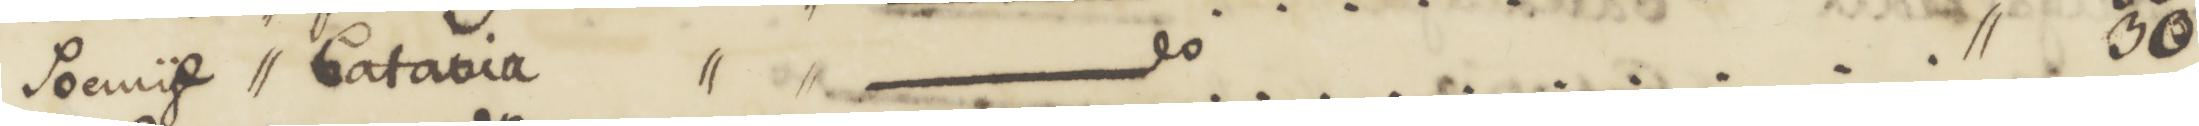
soemije „ batavia „ „ do „ - - - - - - - - - - 30
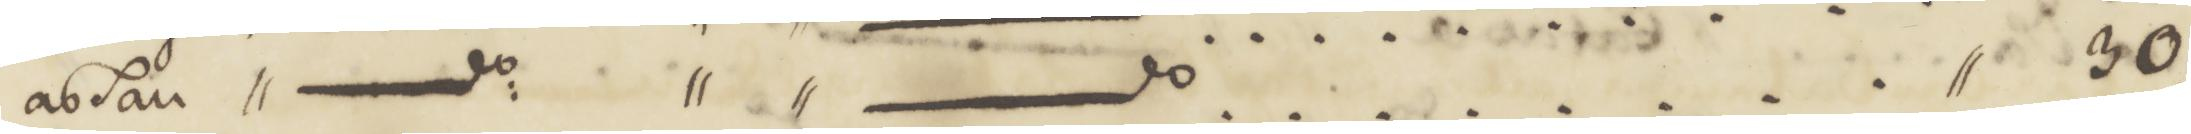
assan „ d:o „ „ do - - - - - - - - „ 30
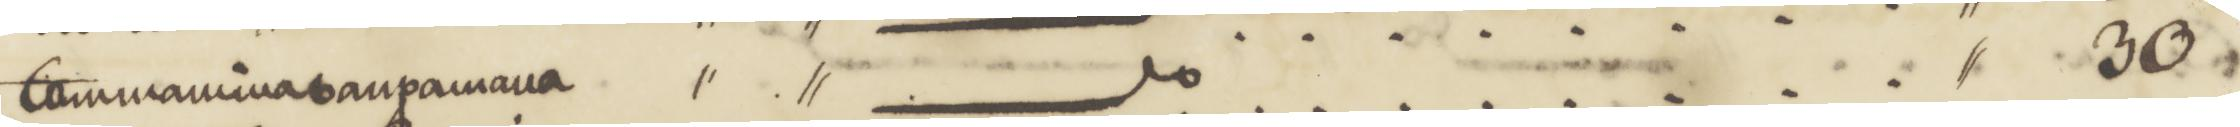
tammaminavanpamana „ „ do - - - - - - - - „ 30
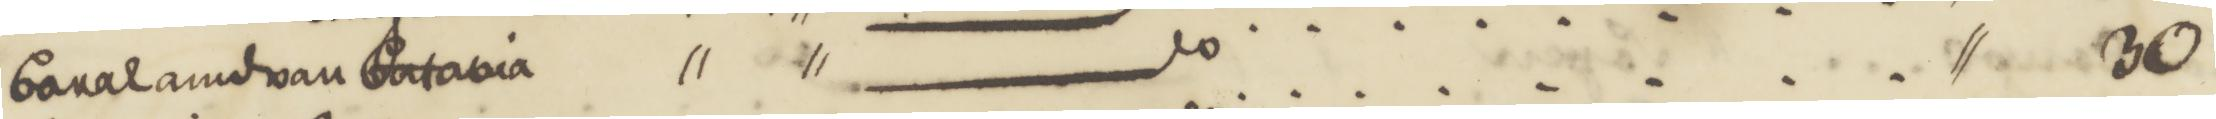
baralame van batavia „ „ do - - - - - - - - „ 30
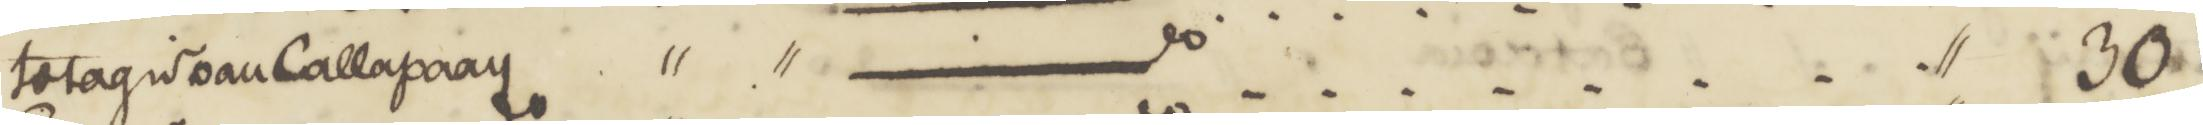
totagie van Callapaay „ „ do - - - - - - - - „ 30
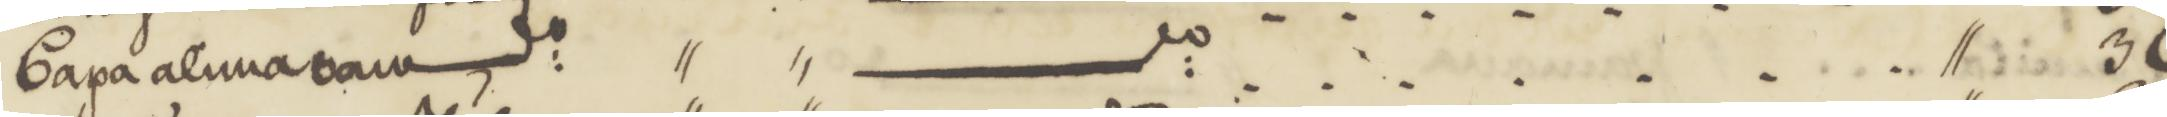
bapa alima van d:o „ „ d:o - - - - - - - „ 30
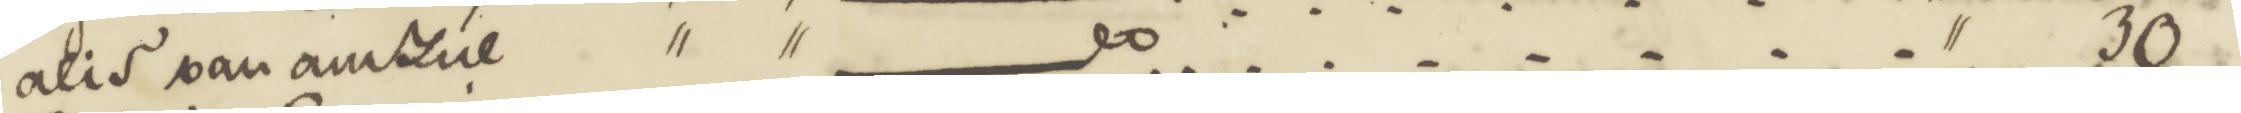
alie van amzul „ „ do - - - - - - - „ 30
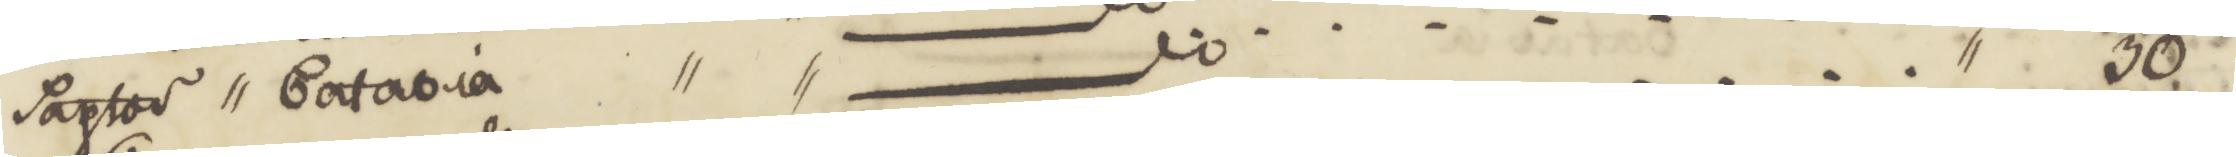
saptoe „ batavia „ „ do - - - - - - - - - „ 30
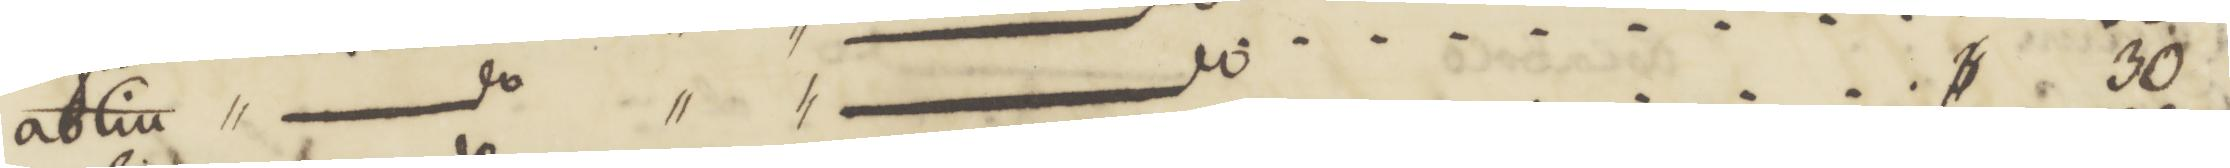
abtin „ do „ „ do - - - - - - - - - „ 30
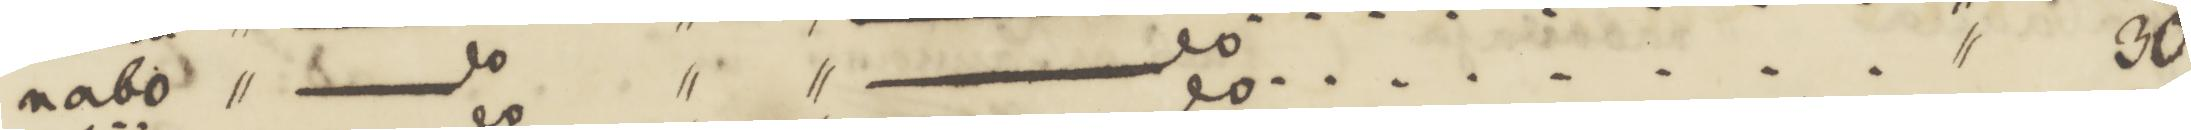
rabo „ do „ „ do - - - - - - - - „ 30
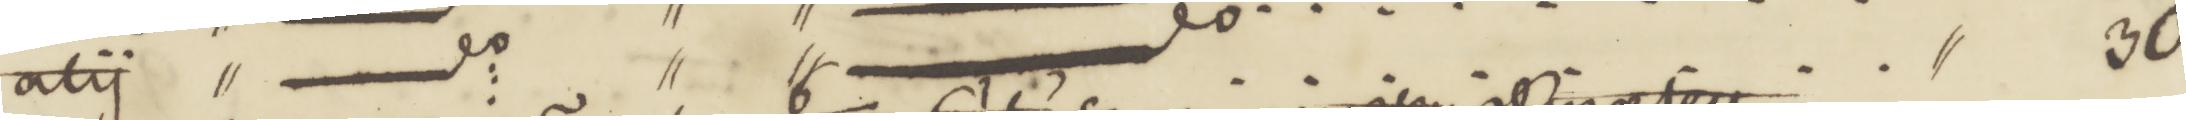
atij „ d:o „ „ do - - - - - - - - „ 30
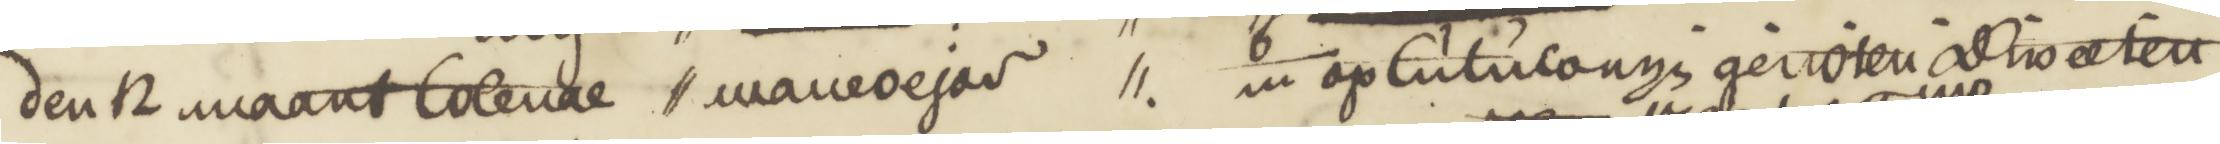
den 12 maart tolenae „ maneoejoe „ 6/m op tutuloryn genoten Teweeten
